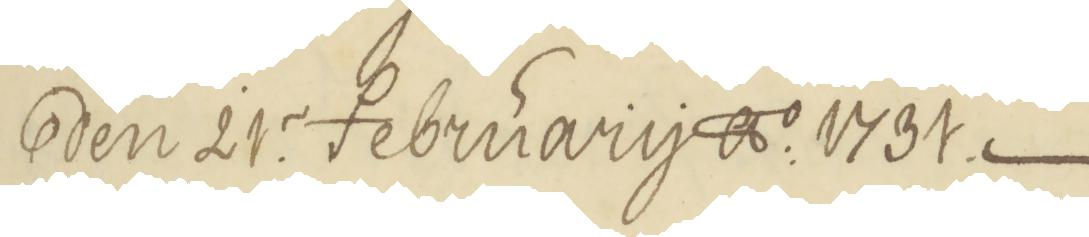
den 21:e februarij A:o 1731. —
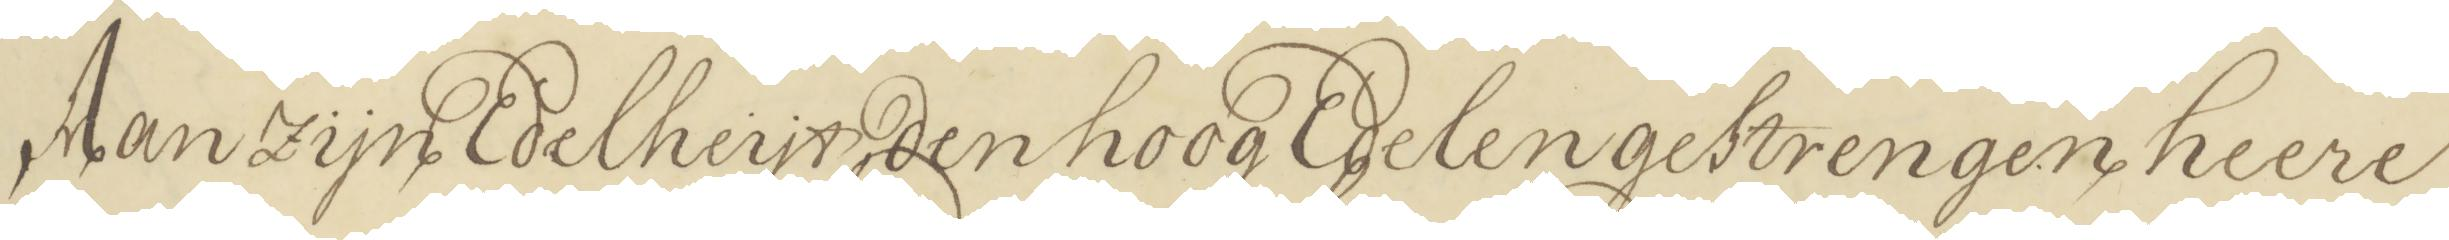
Aan zijn Edelheijt, den hoog Edelen gestrengen heere
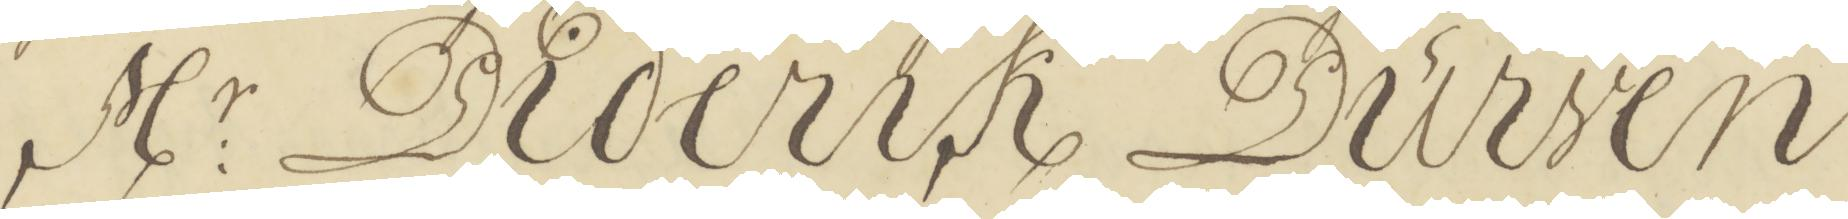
M:r Diderik Durven
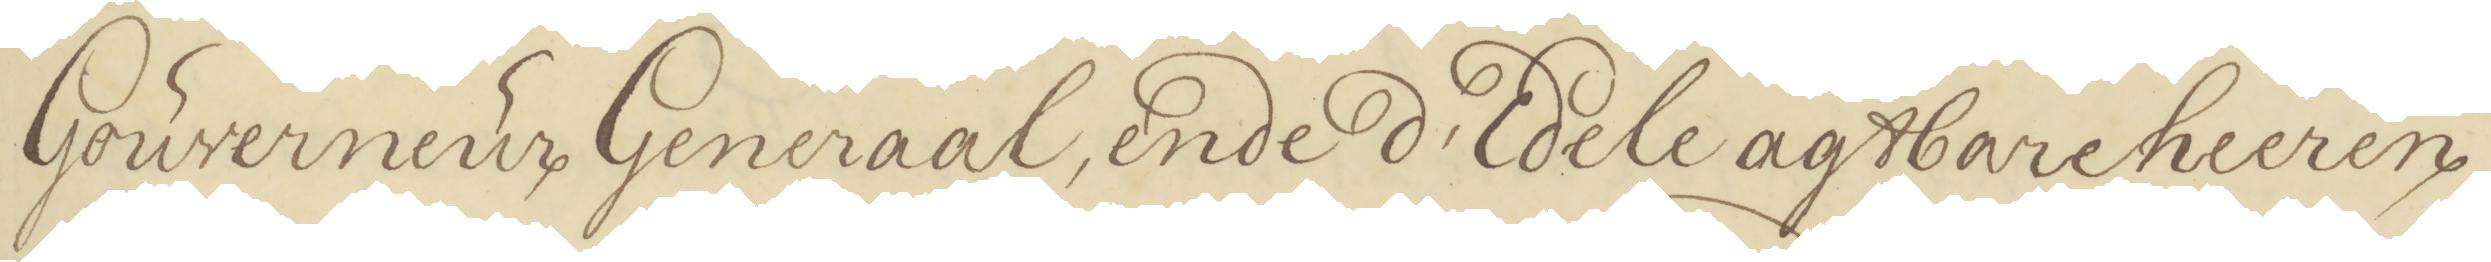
Gouverneur Generaal, ende d’Edele agtbare heeren
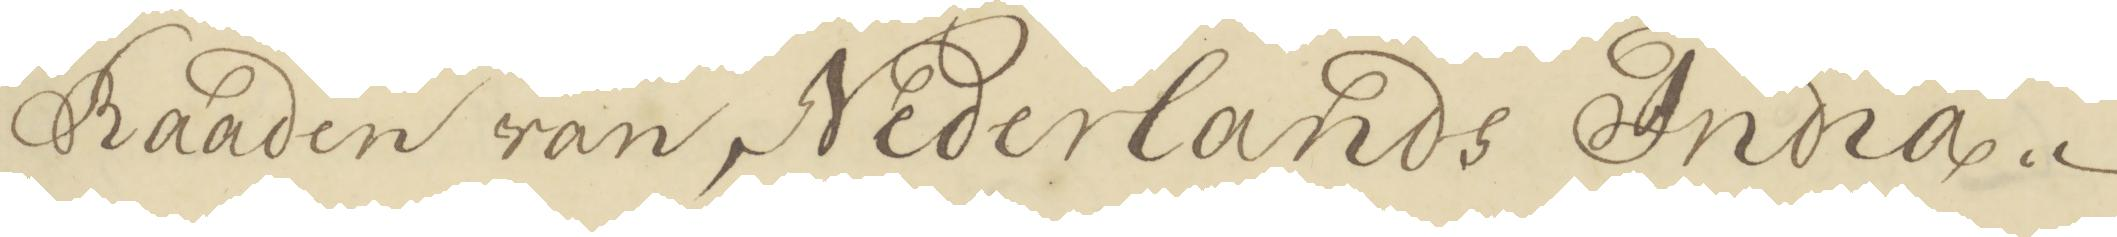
Raaden van Nederlands India.-
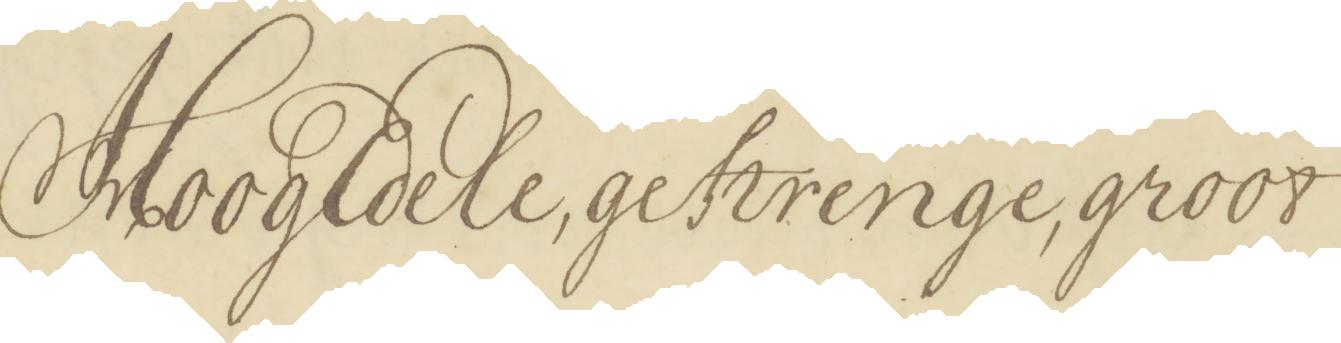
HoogEdele, gestrenge, groot
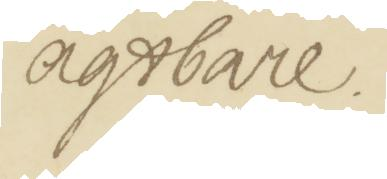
agtbare
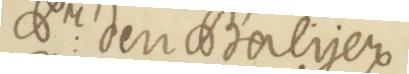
P:m den Balijer
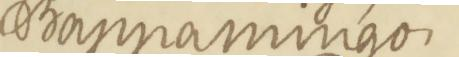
Bappamingo
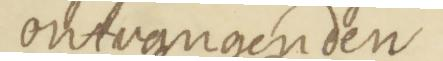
ontvangen den
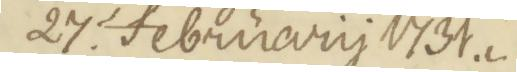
27.e Februarij 1731.-
